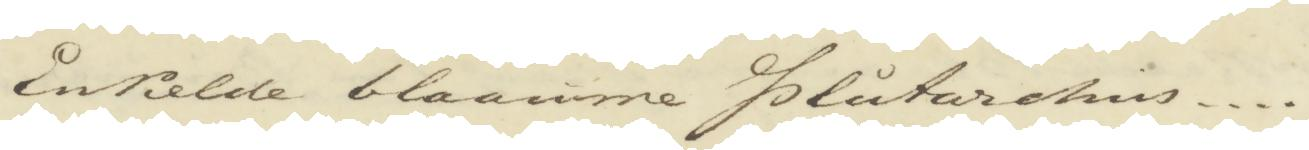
Enkelde blaauwe Plutarchus
